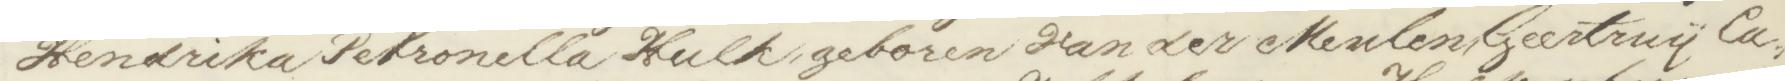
Hendrika Petronella Hulk, geboren van der Meulen, Geertruij Ca
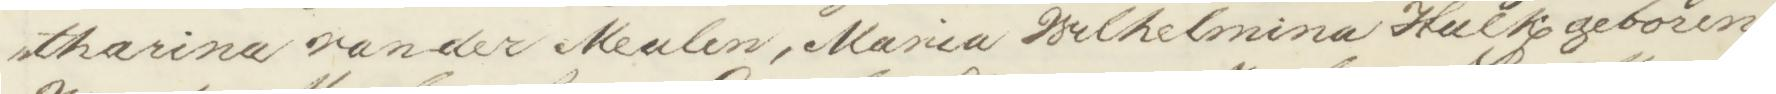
„tharina van der Meulen, Maria Wilhelmina Hulk geboren
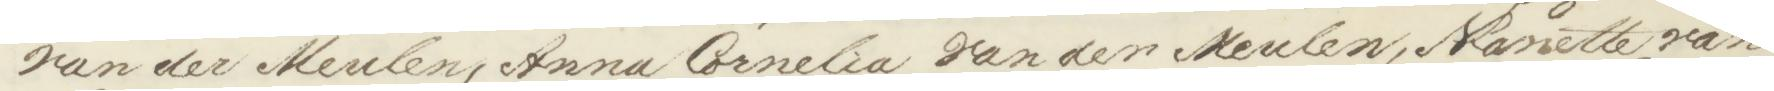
van der Meulen, Anna Cornelia van der Meulen, Nanette van
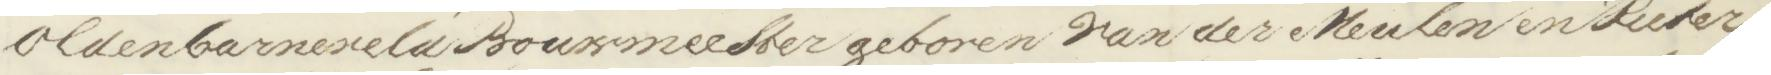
Oldenbarneveld Bouwmeester geboren van der Meulen en Pieter
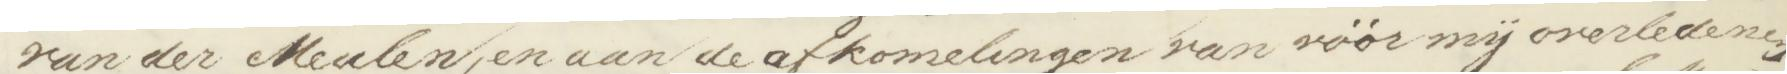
van der Meulen, en aan de afkomelingen van vóór mij overledenen
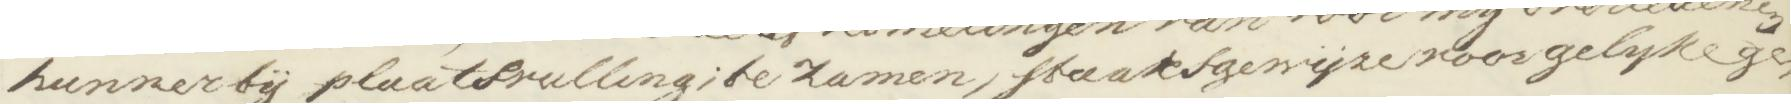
hunner bij plaatsvulling; te zamen, staaksgewijze voor gelyke ge
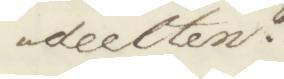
„deelten.
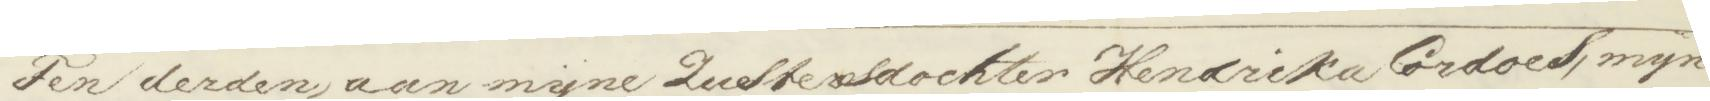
Ten derden, aan mijne Zustersdochter Hendrika Cordoes, mijn
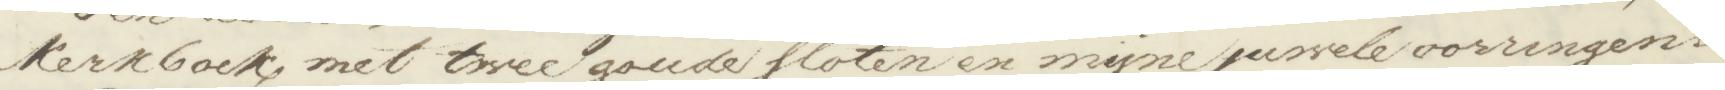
kerkboek, met twee goude sloten en mijne juwele oorringen.
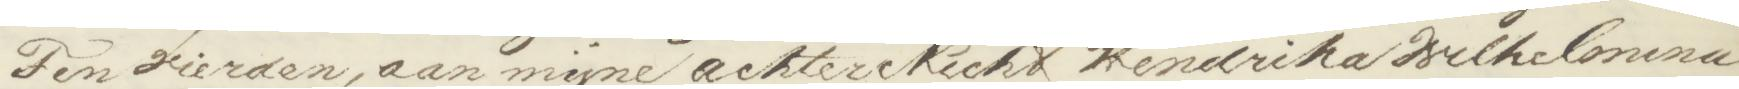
Ten Vierden, aan mijne achter Nicht Hendrika Wilhelmina
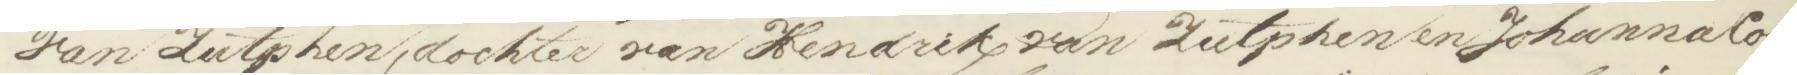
van Zutphen, dochter van Hendrik van Zutphen en Johanna Cor
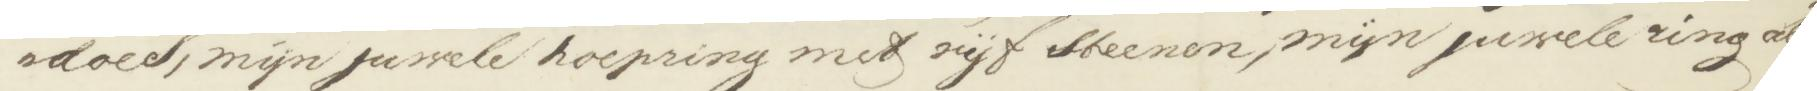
does, mijn juwele hoepring met vijf steenen, mijn juwele ring als
